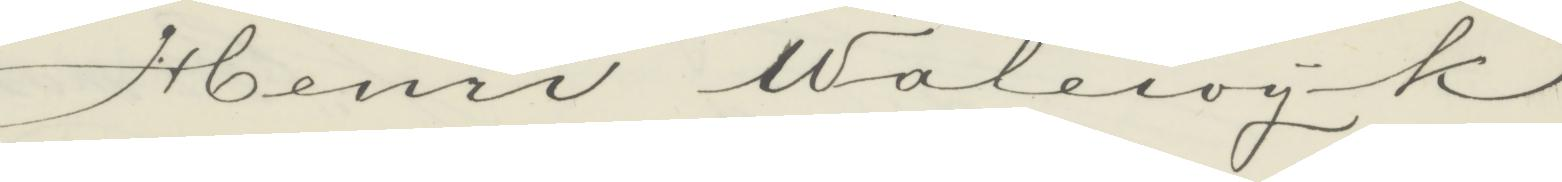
Henri Walewijk
